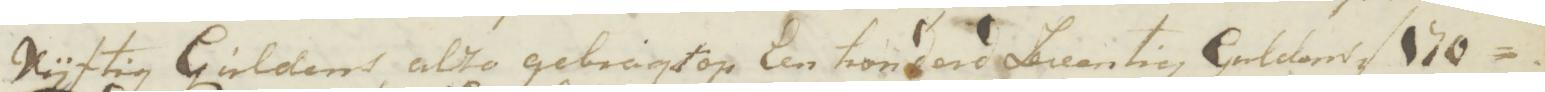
Vijftig Guldens, alzo gebragt op Een honderd Zeventig Guldens ƒ 170 =
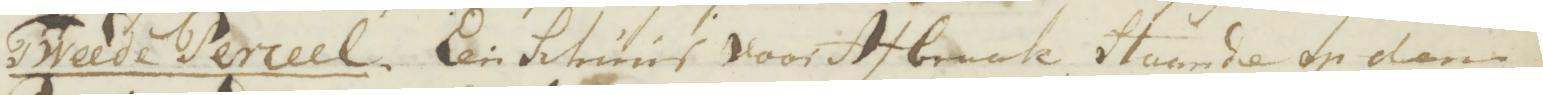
Tweede Perceel. Een Schuur voor Afbraak, Staande op den
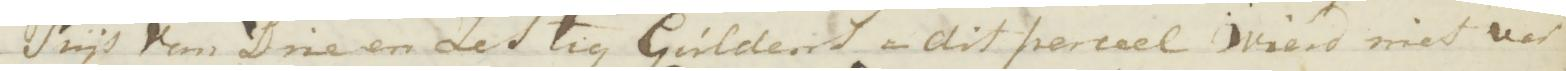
Prijs van Drie en Zestig Guldens - dit perceel Wierd niet ver
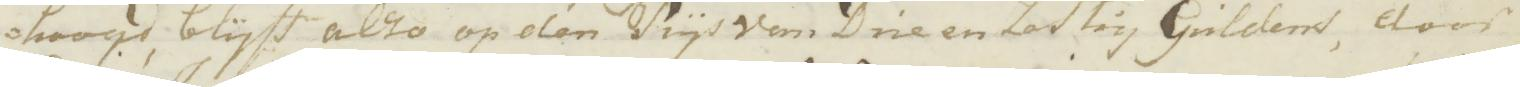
=hoogd, blijft alzo op den Prijs van Drie en Zestig Guldens, door
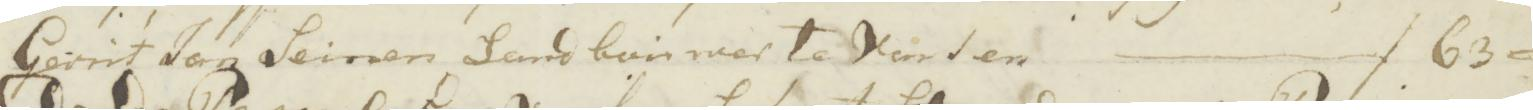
Gerrit Ian Seinen Landbouwer te Varsen — ƒ 63=
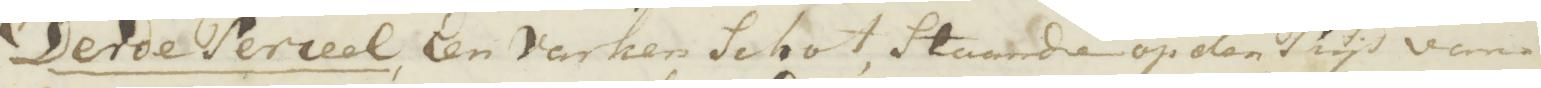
Derde Perceel, Een varken schot, Staande op den Prijs van=
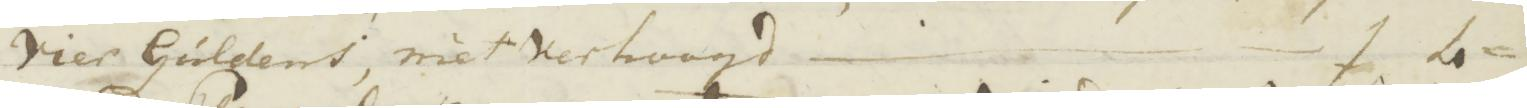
Vier Guldens, niet verhoogd — — ƒ 4=
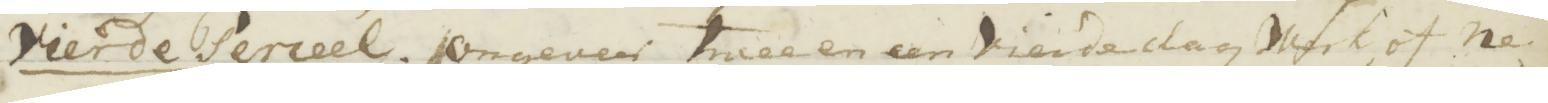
Vierde Perceel. ongeveer twee en een vierde dag werk, of ne„
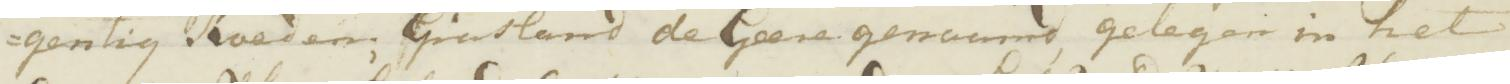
=gentig Roeden, Grasland de Geere genaamd, gelegen in het
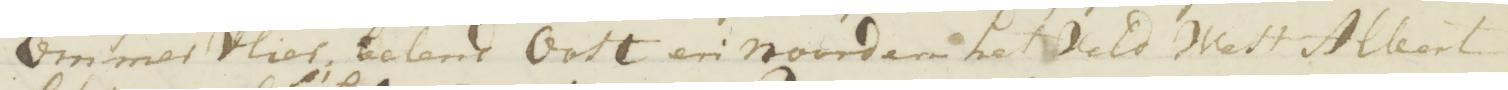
Ommer Vlier, belend Oost en noorden het Veld West Albert
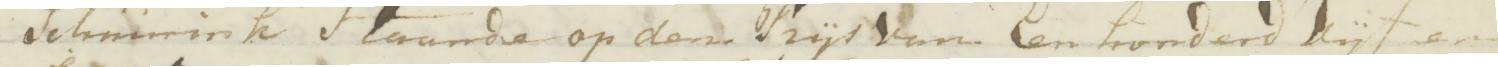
Schuinink Staande op den Prijs van Een honderd Vijf en
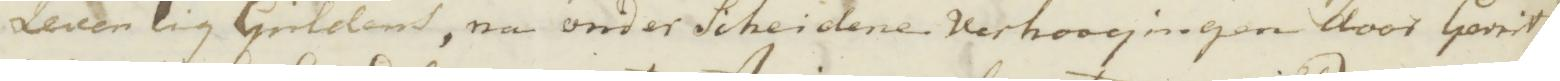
Zeventig Guldens, na onderscheidene verhoogingen door Gerrit
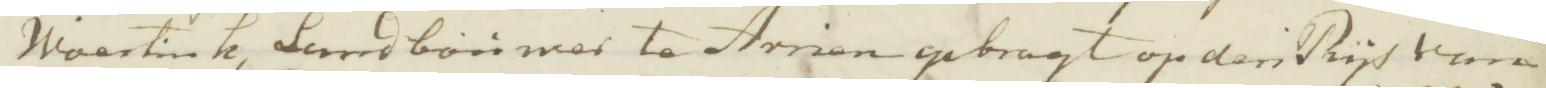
Woertink, Landbouwer te Arrien gebragt op den Prijs van
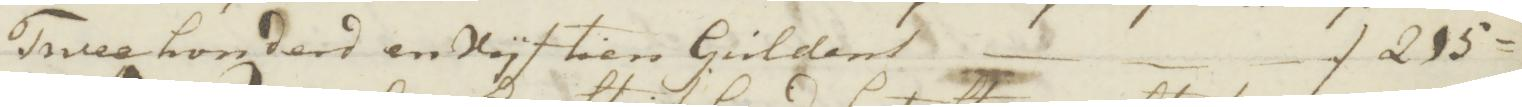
Twee honderd en vijftien Guldens — — —ƒ 215=
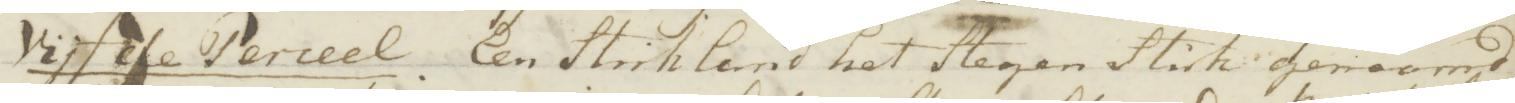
Vijfde Perceel. Een stuk land het Stegen stuk: genaamd
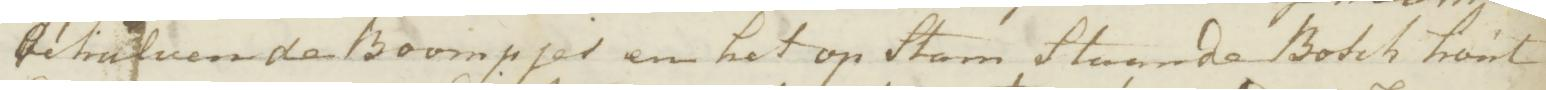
behalven de Boompjes en het op Stam Staande Bosch hout
